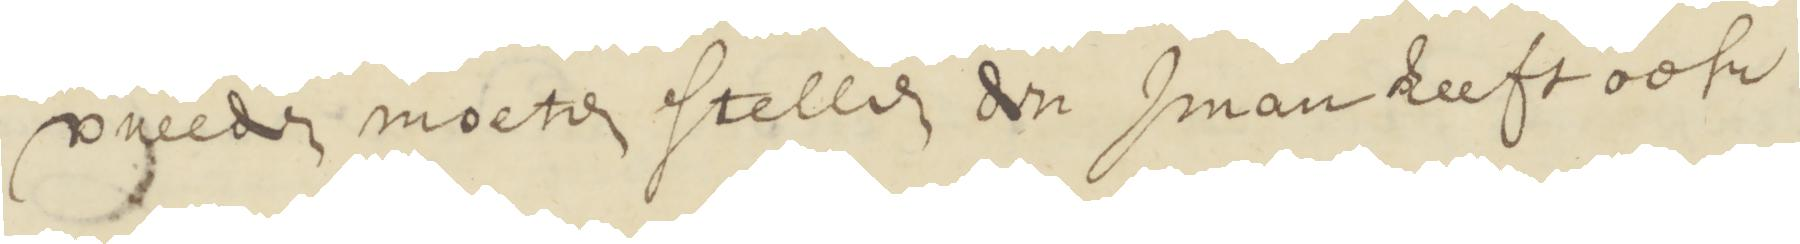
vreeden moeten stellen den jman heeft ook
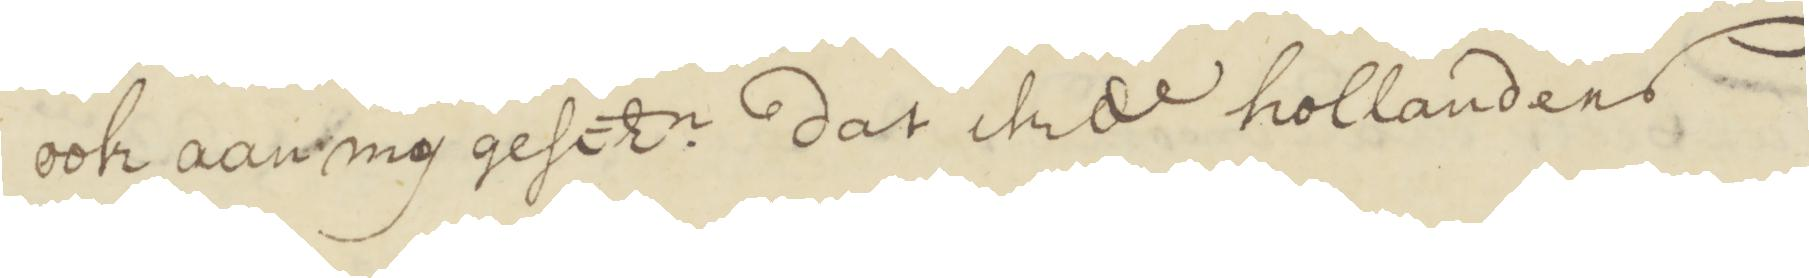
ook aan my gesch.n dat ik de hollanders
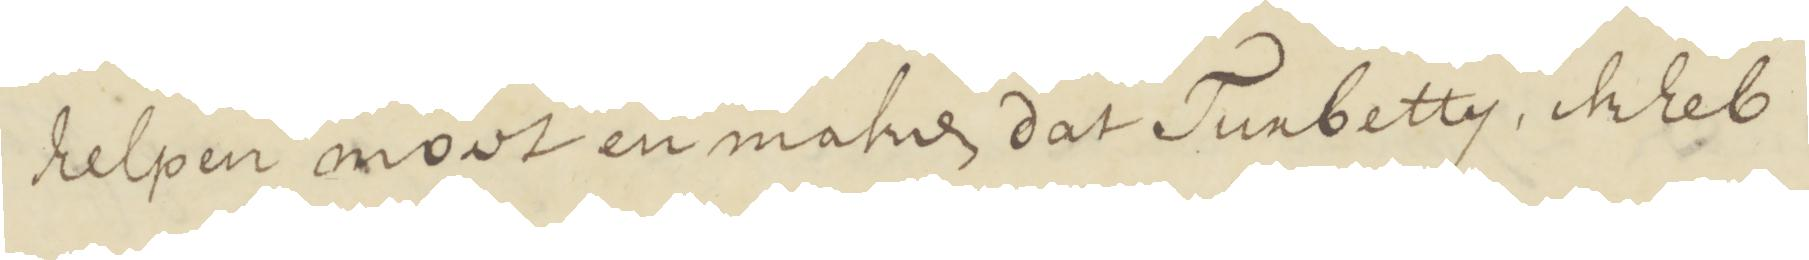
helpen moet en maken dat Turbetty, ik heb
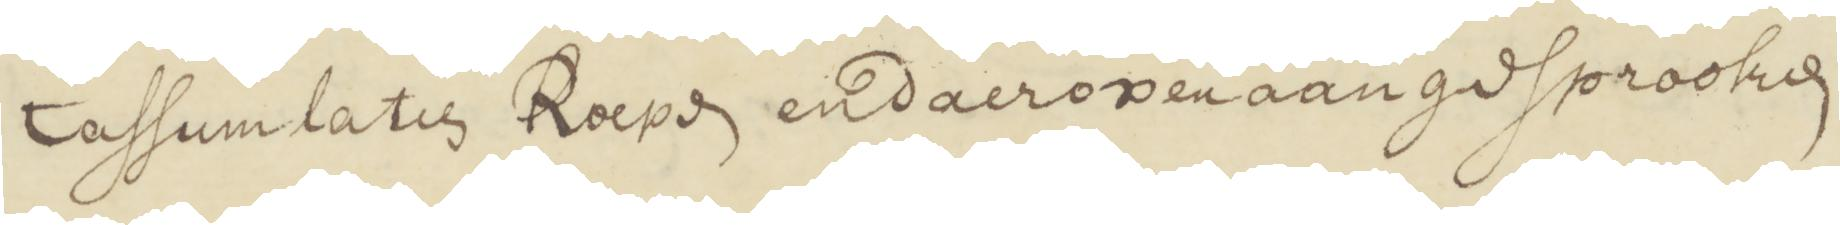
Cassum laten Roepen en daerover aan gesprooken
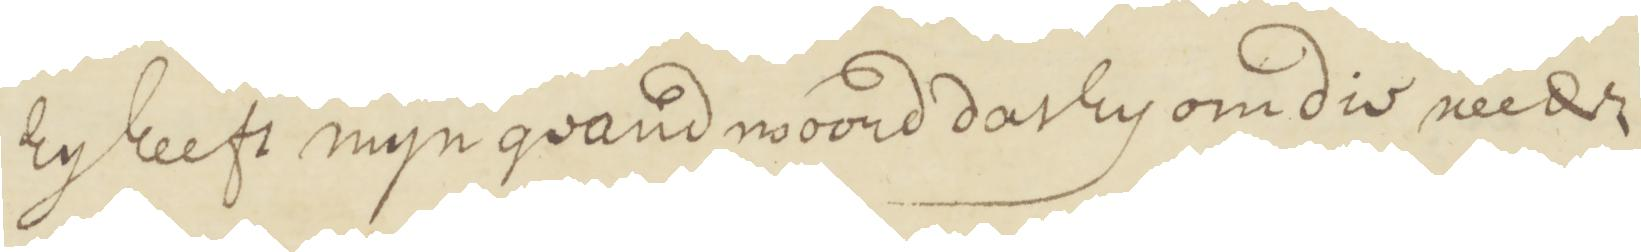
hy heeft myn geandwoord dat hy om die reeden
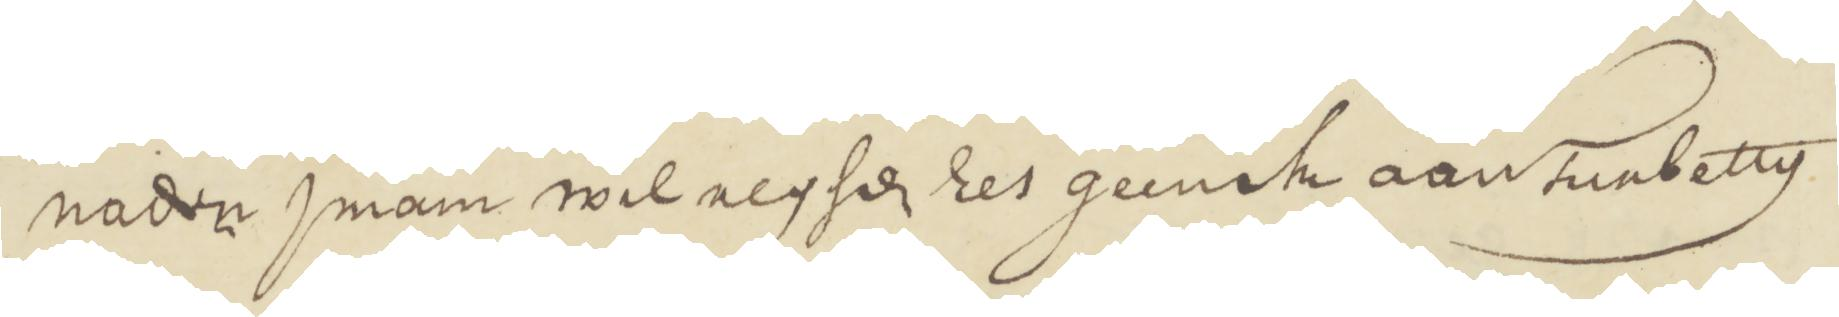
naden jmam wel reysen het geenik aan Turbetty
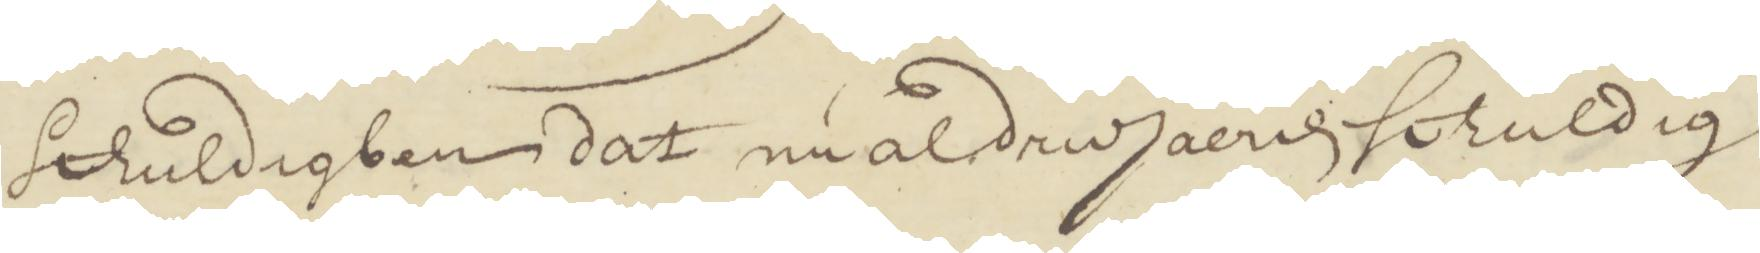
schuldig ben, dat nu al drie jaeren schuldig
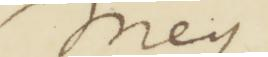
Mey
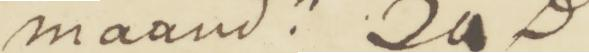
maand.h 24 D
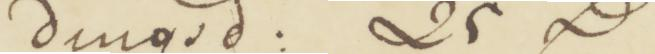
dingsd: 25 D
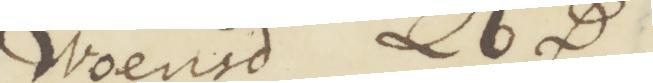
woensd 26 D
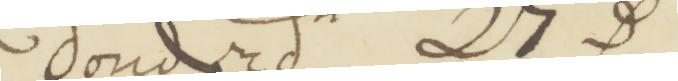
donderdn 27 D
